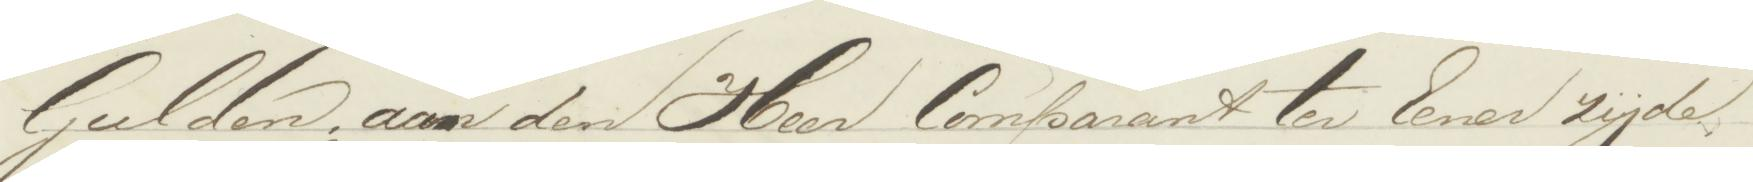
Gulden, aan den Heer Comparant ter Eener zijde,
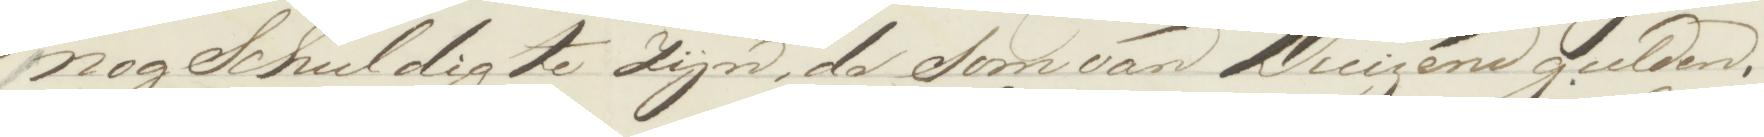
nog schuldig te zijn, de som van Duizend gulden,
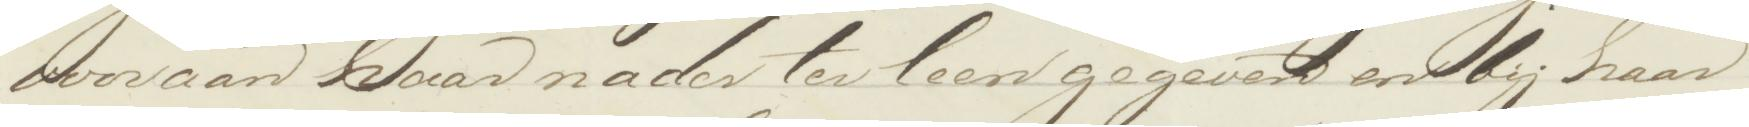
voor aan haar nader ter leen gegeven en bij haar
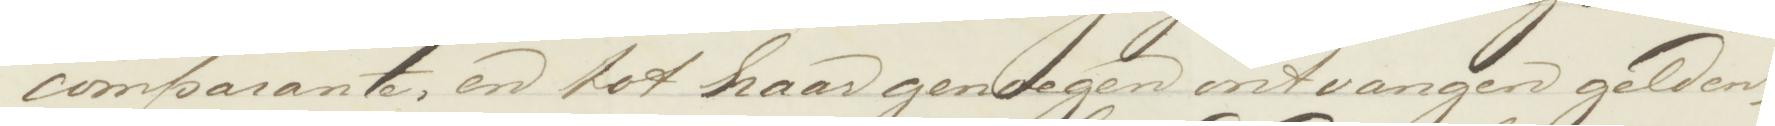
comparante, en tot haar genoegen ontvangen gelden,
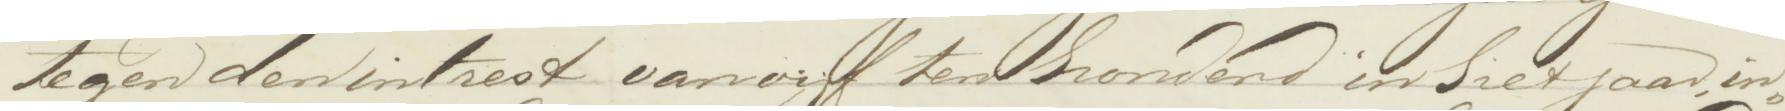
tegen den intrest van vijf ten honderd in het jaar, in„
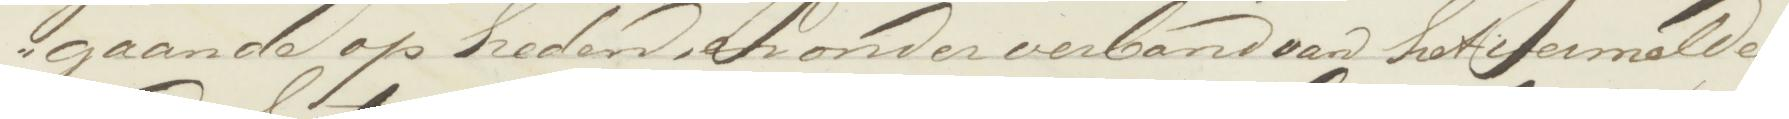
„gaande op heden, en onder verband van het vermelde
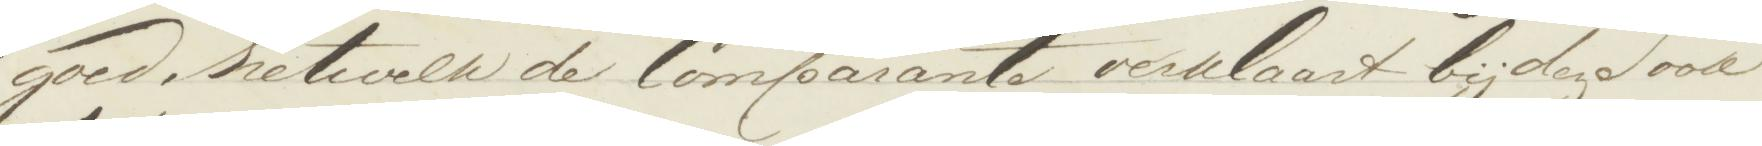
goed, hetwelk de Comparante verklaart bij deze ook
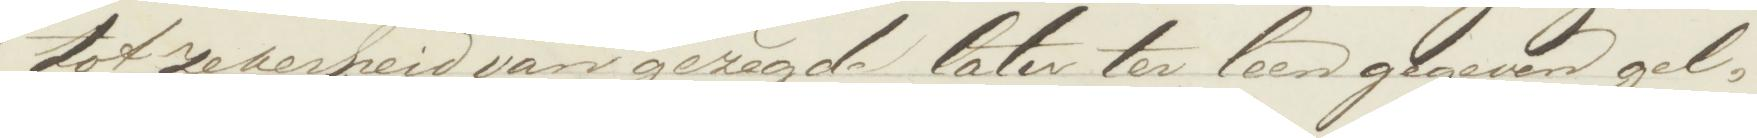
tot zekerheid van gezegde later ter leen gegeven gel„
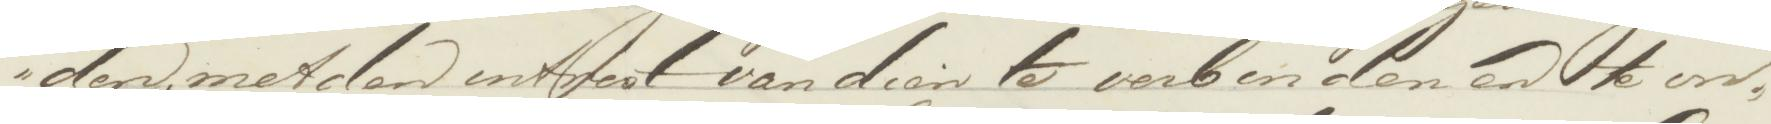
„den, met den intrest van dien te verbindenen te on„
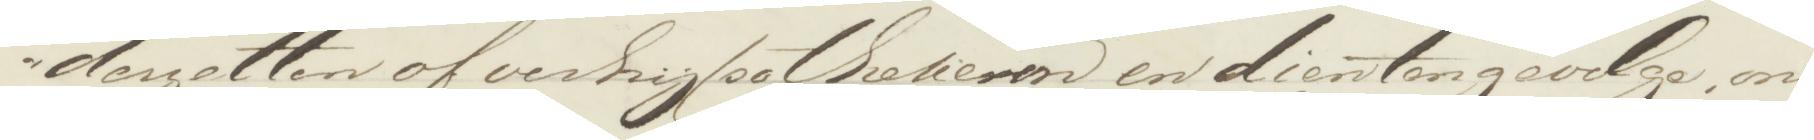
„derzetten of verhijpothekeren en dientengevolge, on
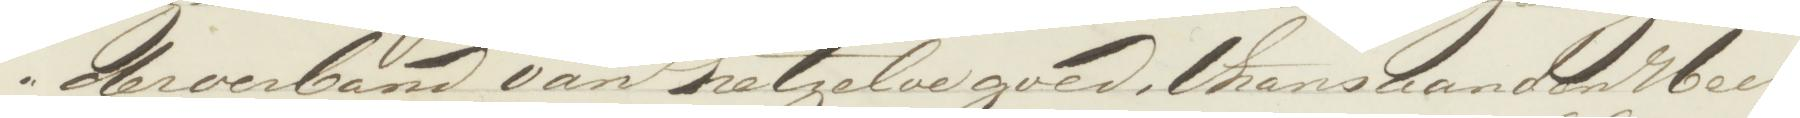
„der verband van hetzelve goed, thans aan den Heer
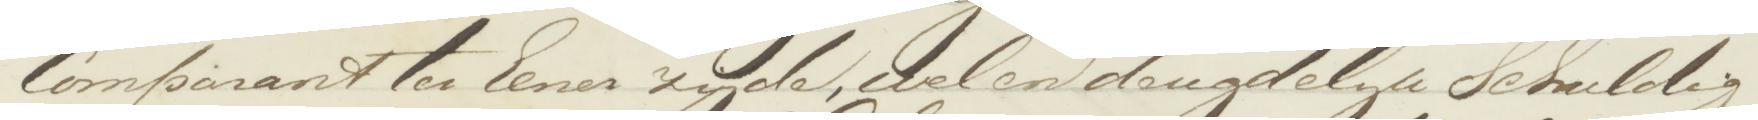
Comparant ter Eener zijde, wel en deugdelyk schuldig
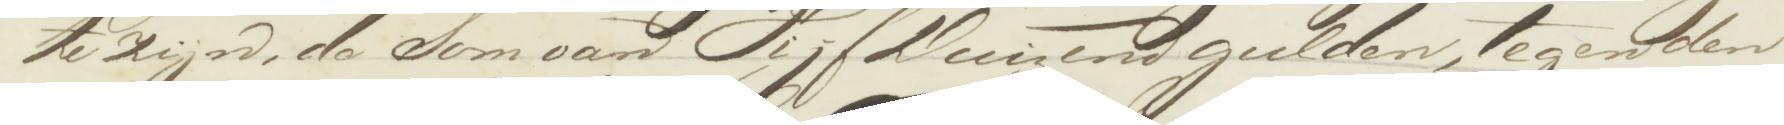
te zijn, de som van Vijf Duizend gulden, tegen den
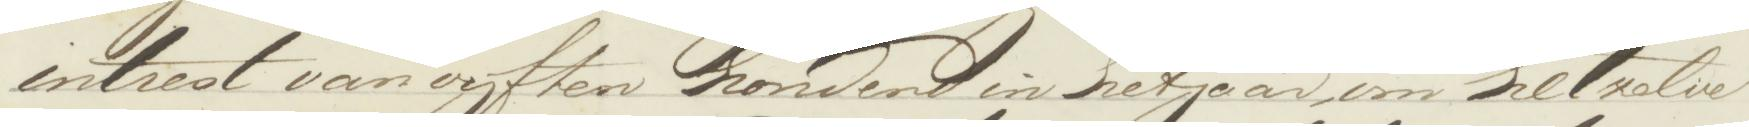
intrest van vyften honderd in het jaar, om hetzelve
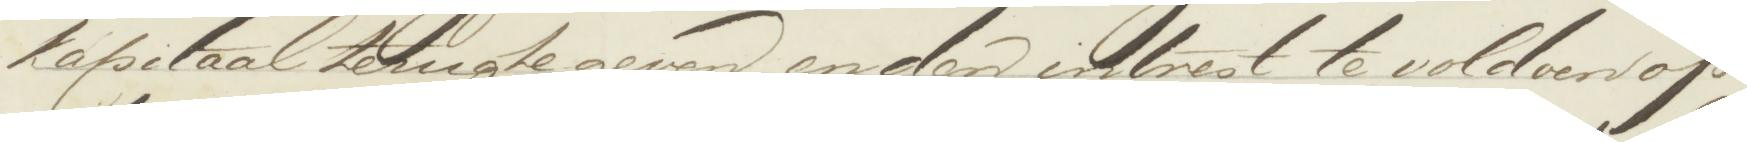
kapitaal terug te geven en den intrest te voldoen op
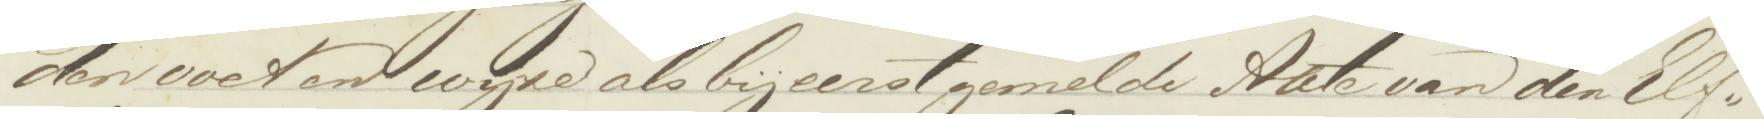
den voet en wyze als bij eerst gemelde Akte van den Elf„
